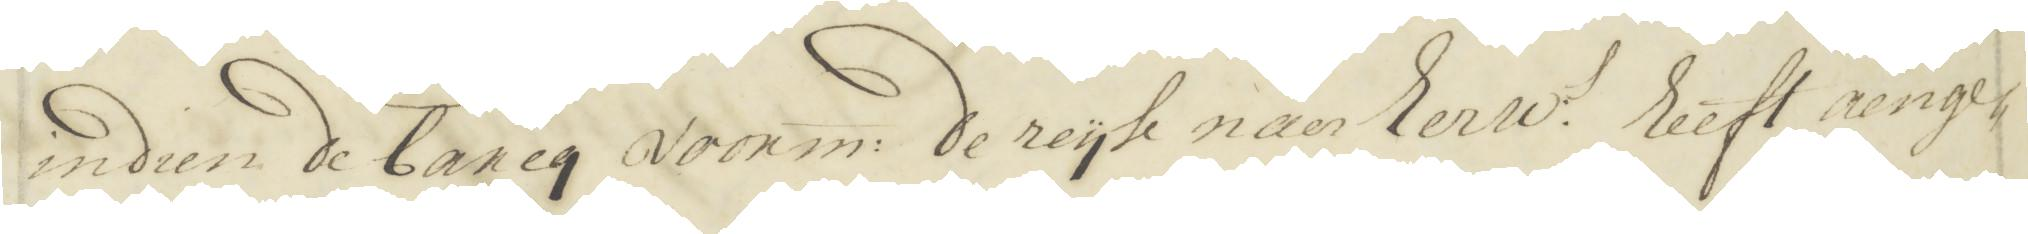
in dien de barcq voorm: de reijk naer herw:s heeft aenge„
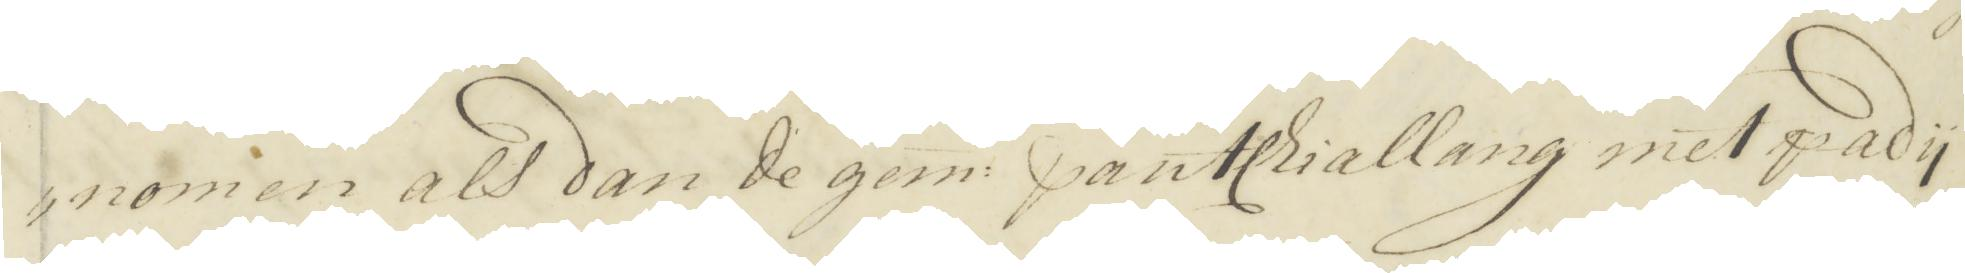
„nomen als dan de gem: pantchiallang met padij
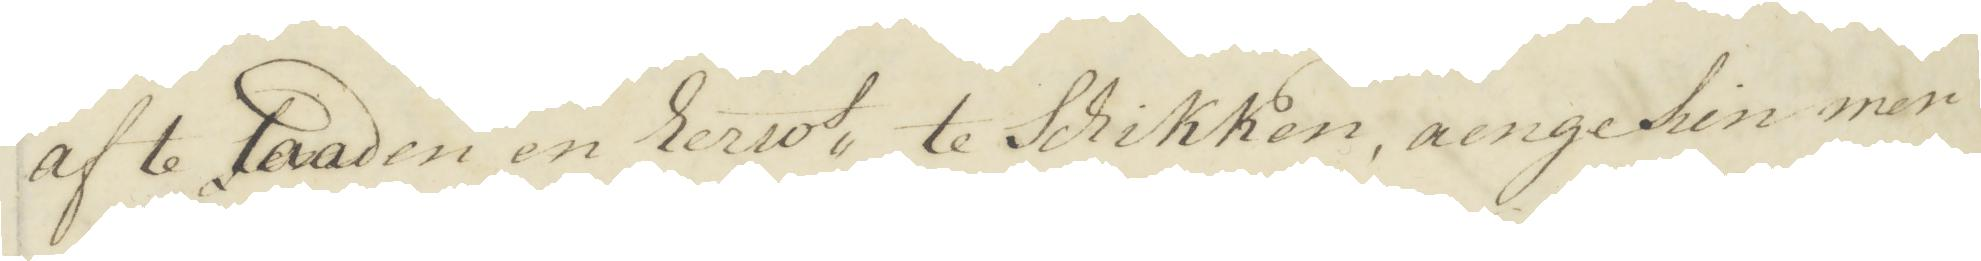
af te laaden en herw„s te schikken, aengesien men
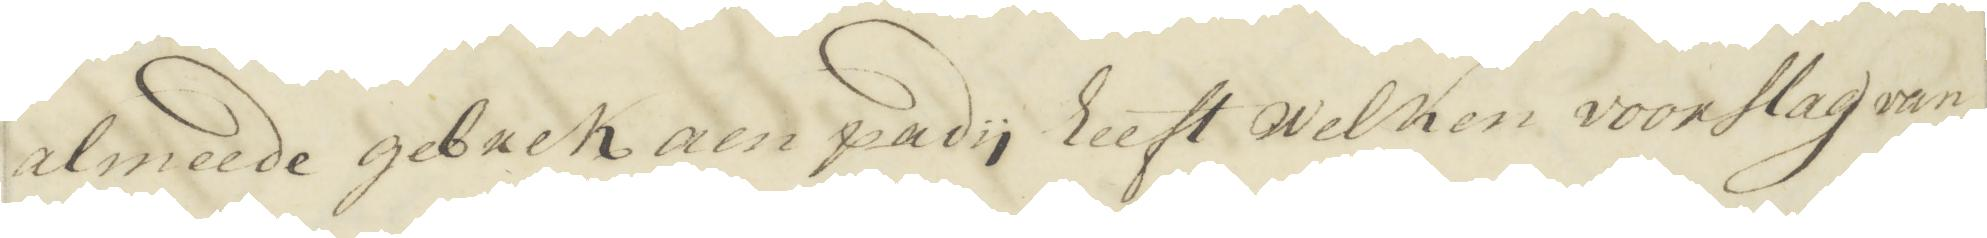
almeede gebrek aen padij heeft welken voorslag van
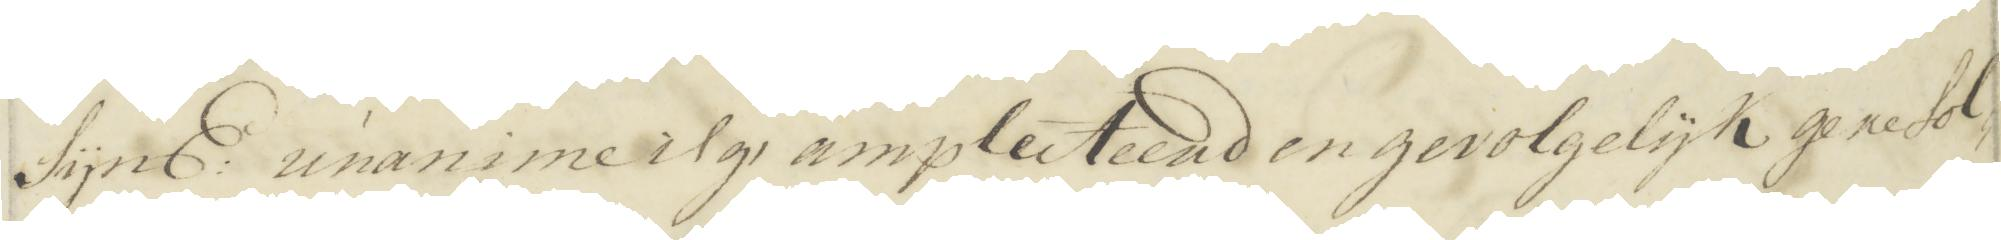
sijn E: unanime is g' amplecteerd en gevolgelijk geresol„
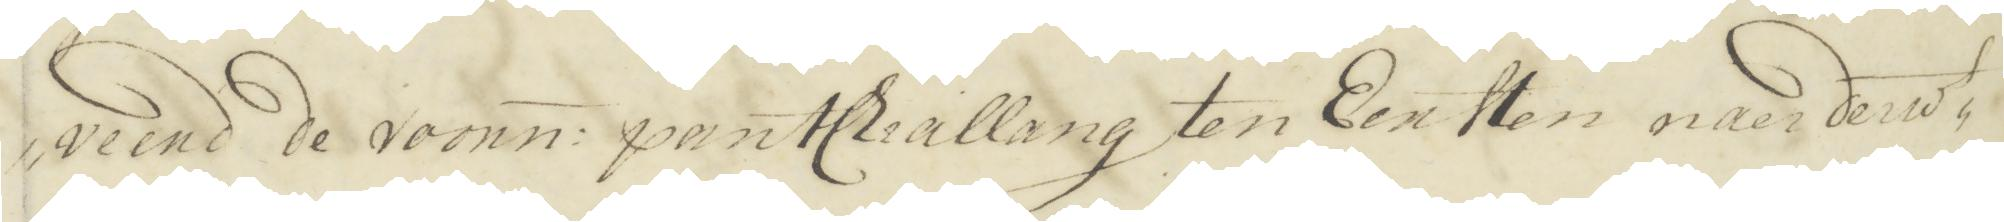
„veerd de voorn: pantchiallang ten Eersten naer derw„s
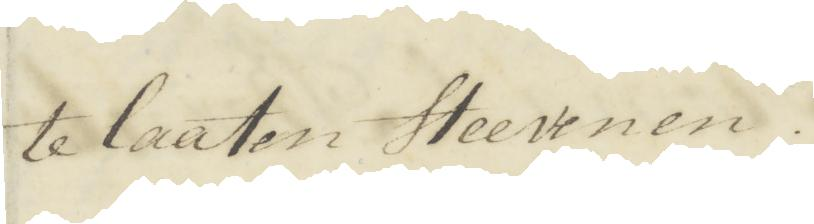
te laaten steevenen
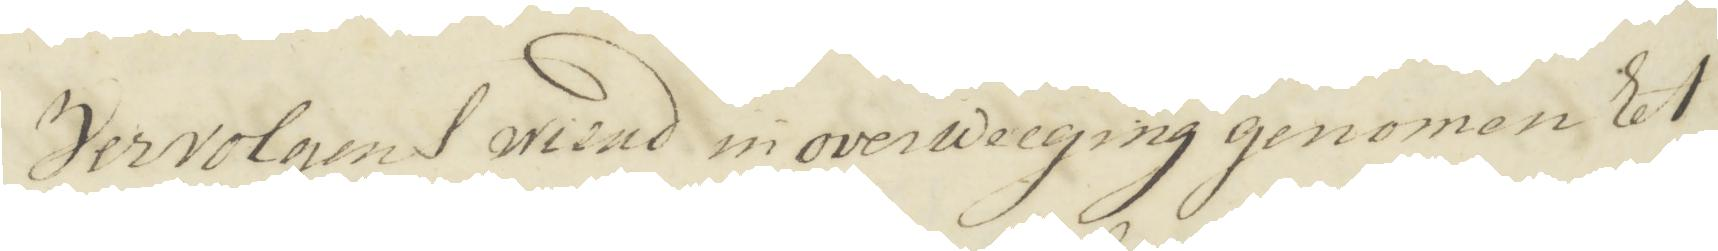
Vervolgens wierd in overweeging genomen het
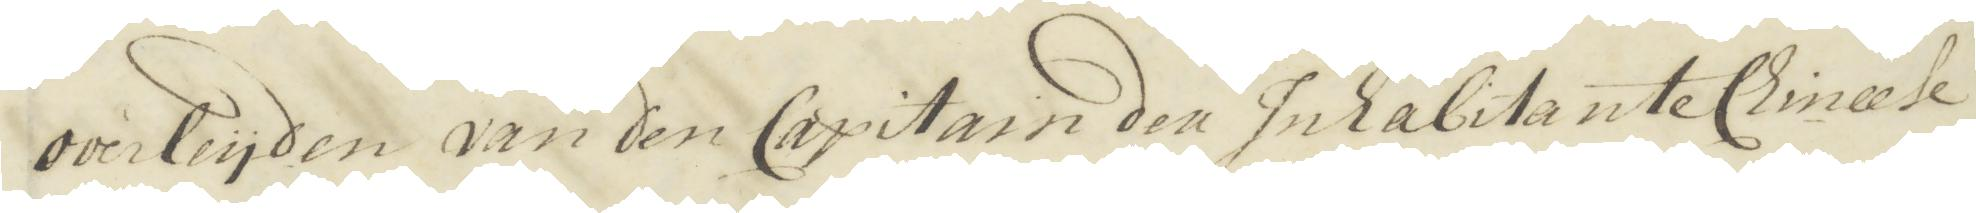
overleijden van den Capitain der Jnhabitante Chineese
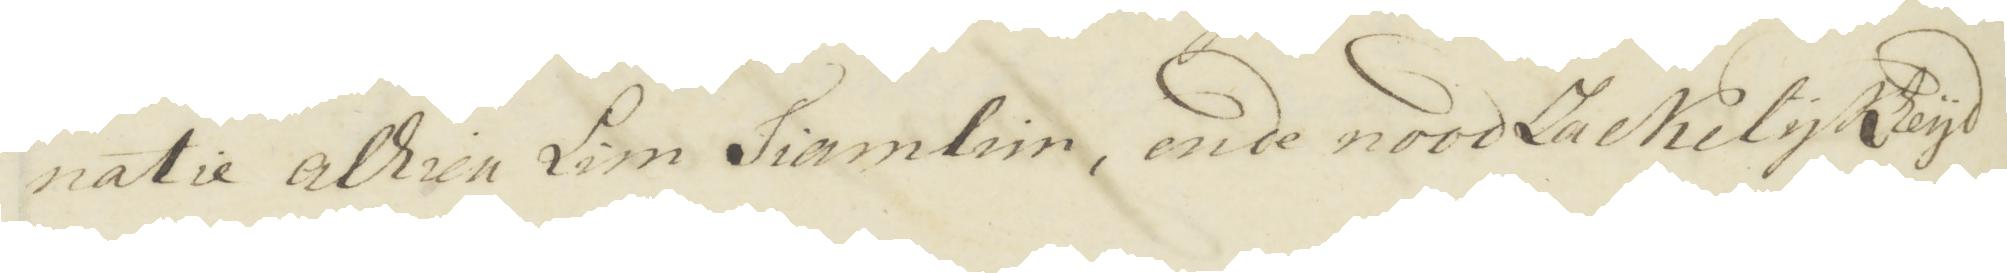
natie alhier Lim Tiambin, ende noodzaekelijkheijd
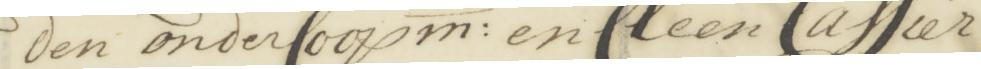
den ondercoopm: en Cleen Cassier
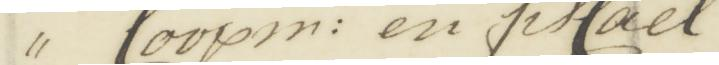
„ Coopm: en fiscael
